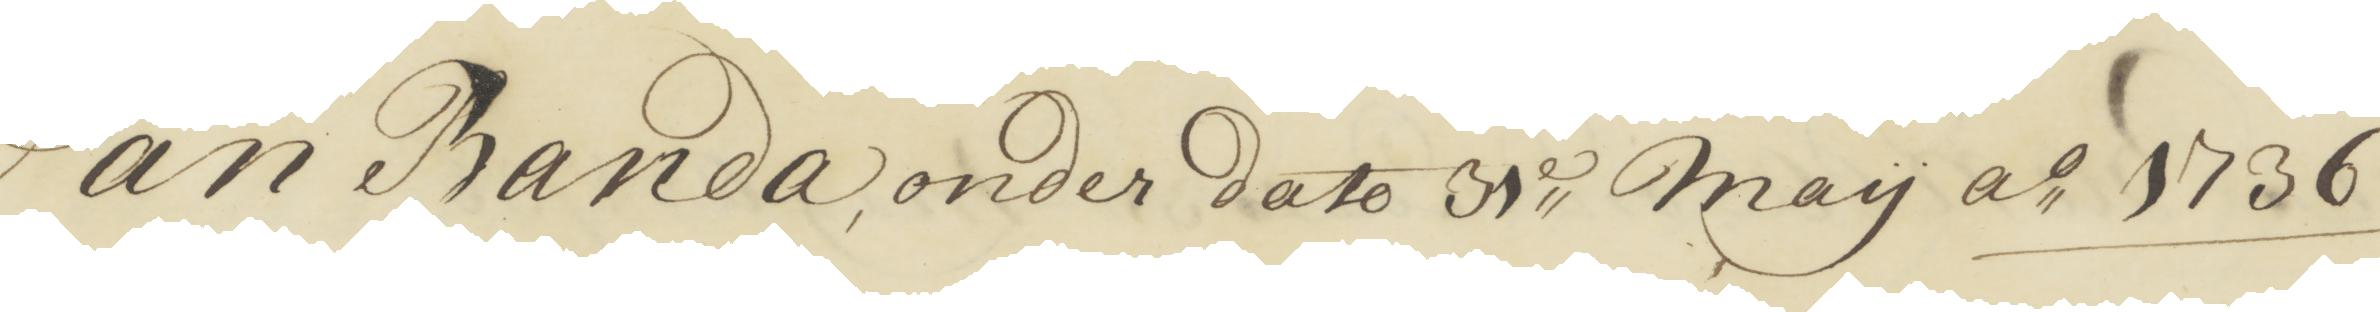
Van Banda, onder dato 31„e Maij a„o 1736
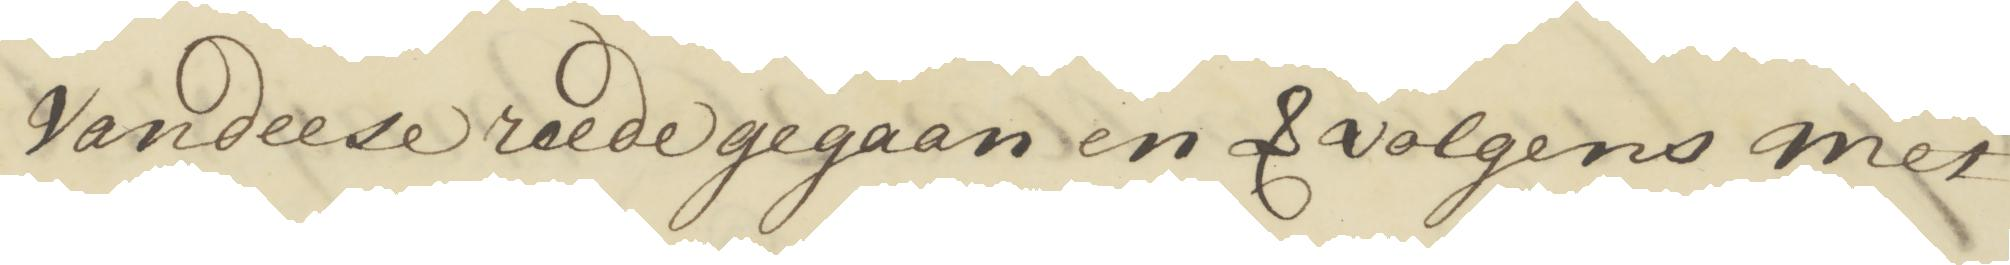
Van deese raede gegaan en vervolgens met
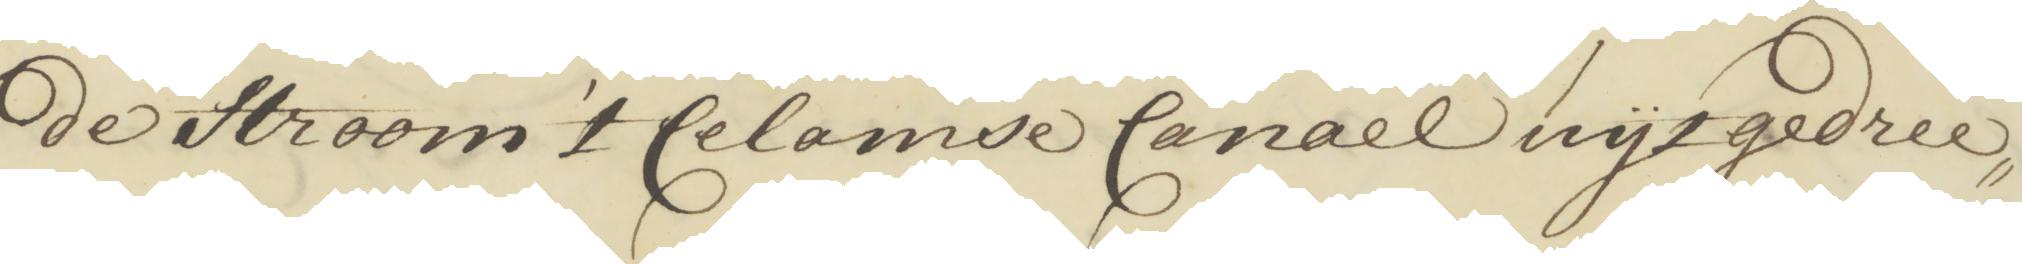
de stroom ’t Celamse Canael uijt gedree„
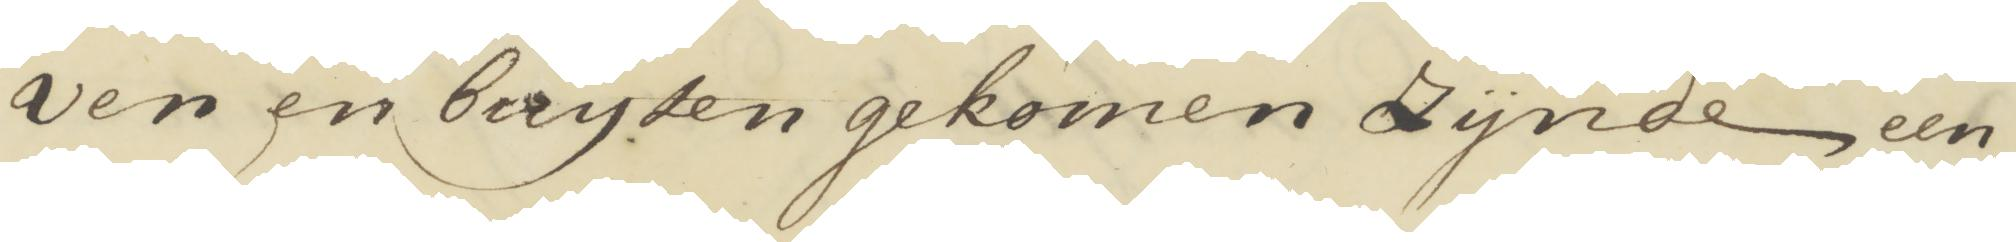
ven en buyten gekomen zijnde een
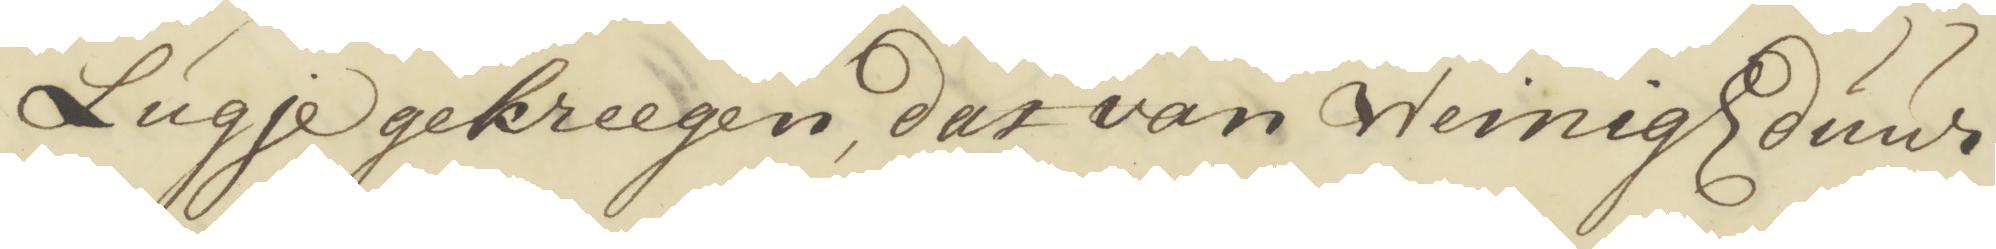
Lugje gekreegen, dat van weinigh duur
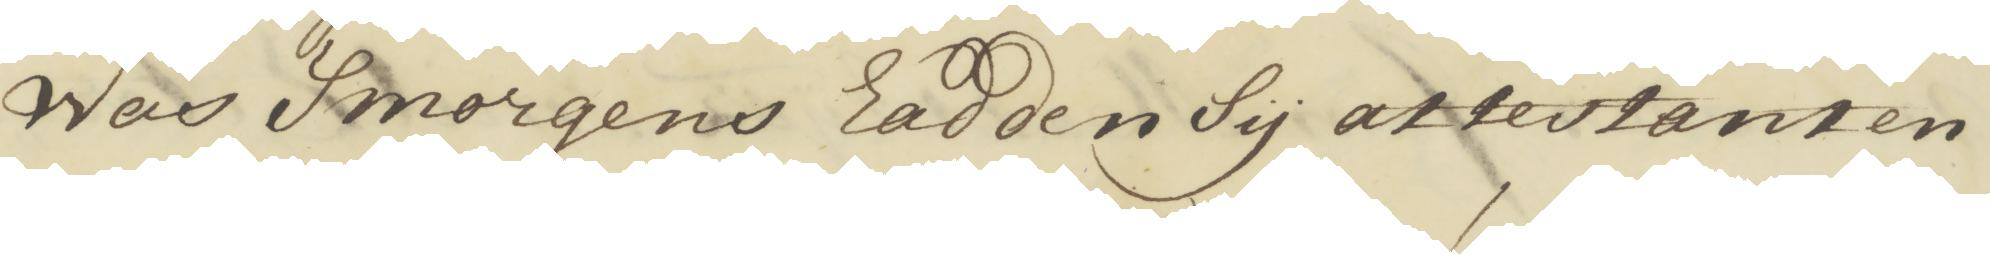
was smorgens hadden sij attestanten
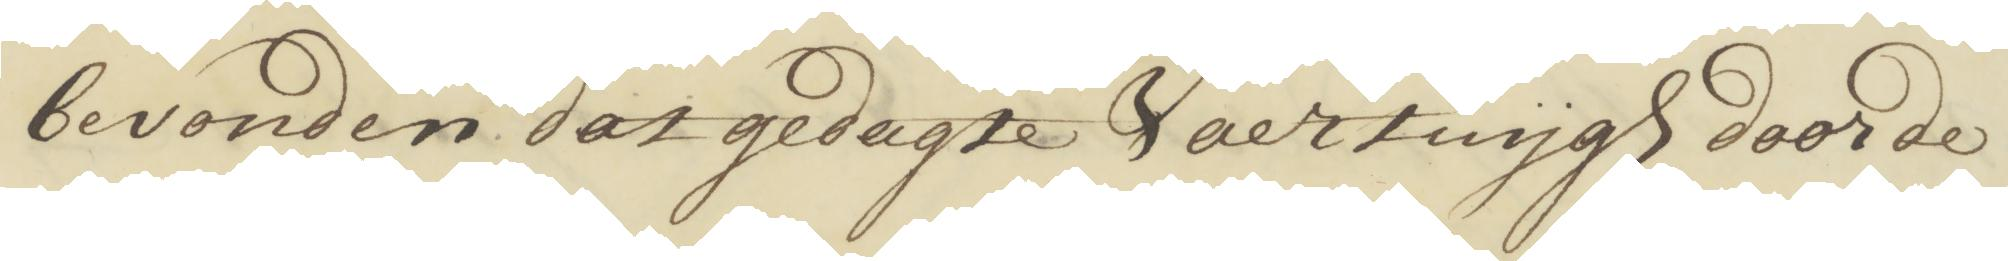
bevonden dat gedagte Vaertuijgh door de
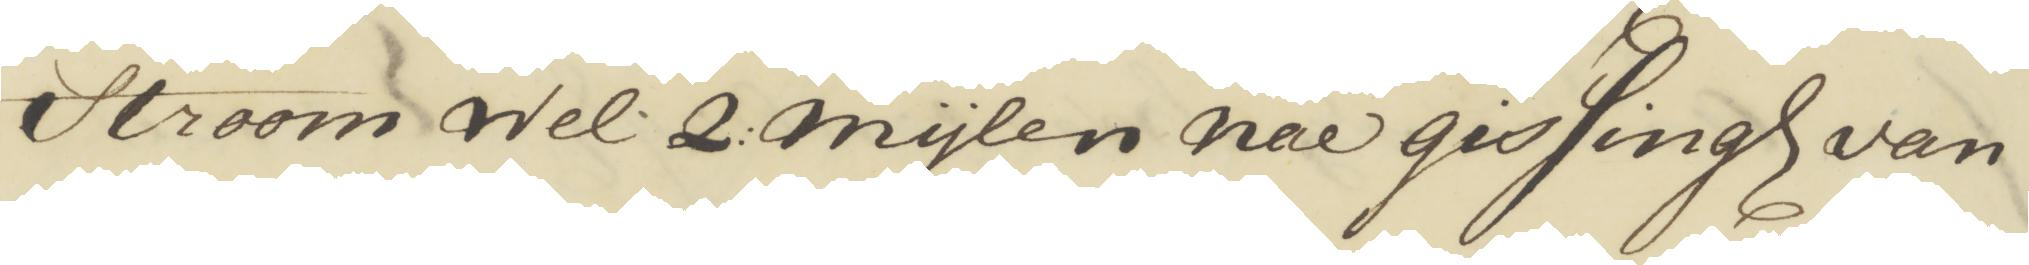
stroom wel 2: mijlen nae gissingh van
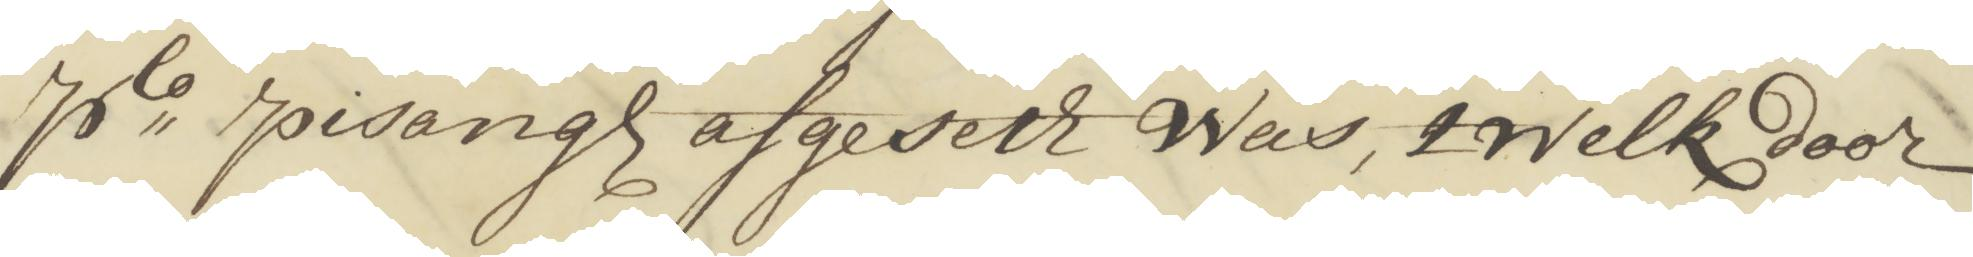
P„lo Pisangh afgeseth was, twelk door
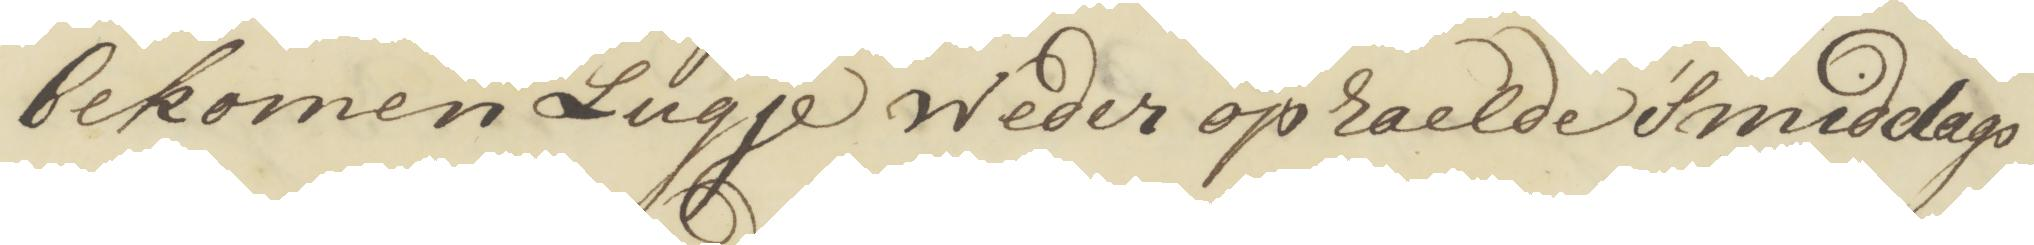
bekomen Lugje weder op haelde 's middags
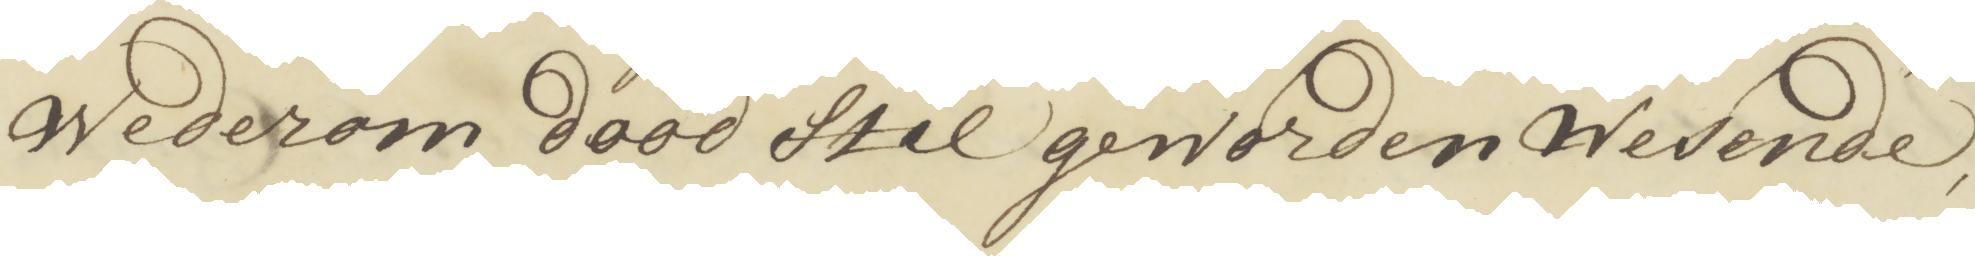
wederom dood stil geworden wesende,
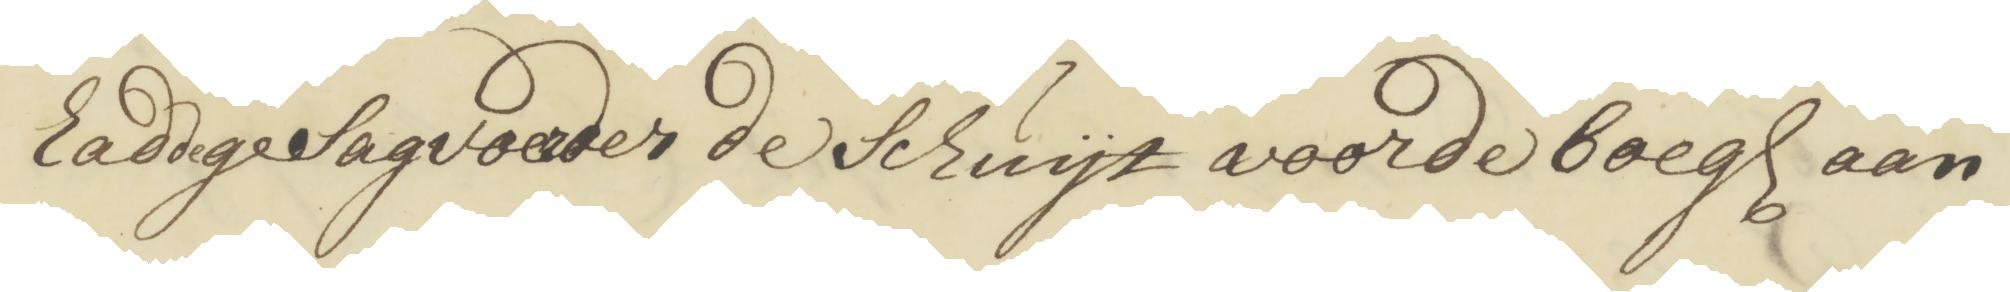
hadde gesagvoerder de schuijt voorde boegh aan
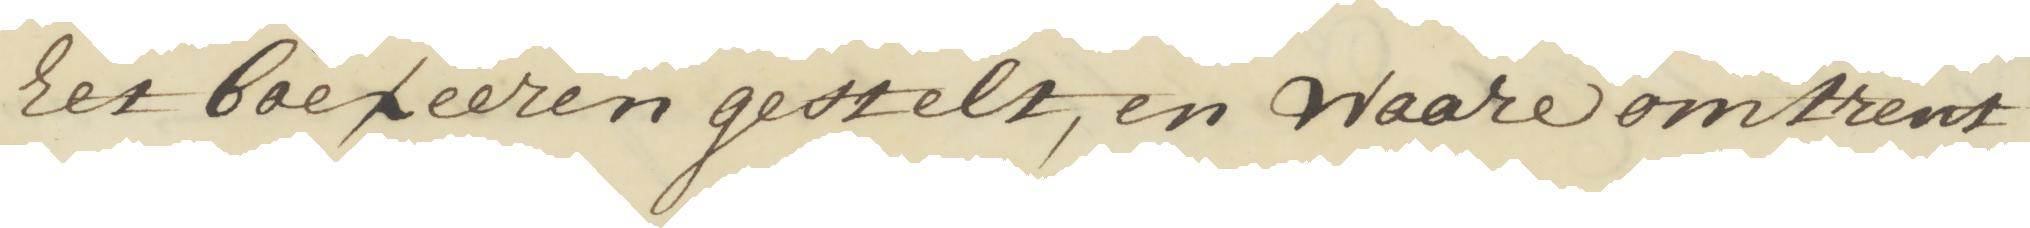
het boekeeren gestelt, en waare omtrent
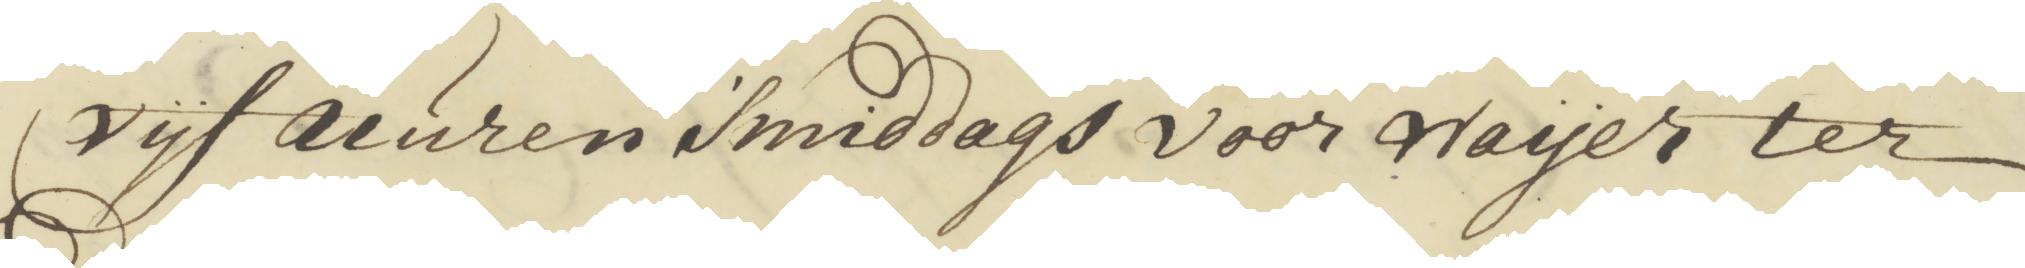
vijf uuren 's middags voor waijer ter
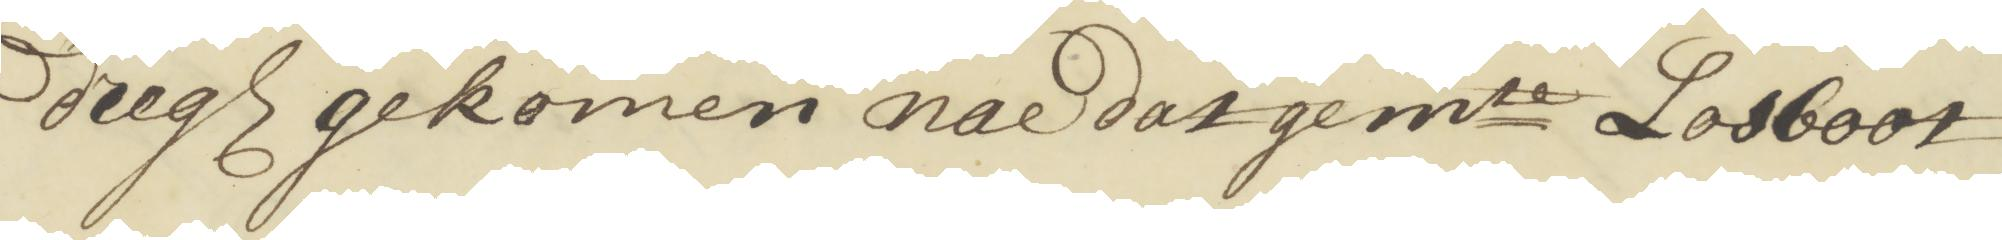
dregh gekomen nae dat gem=te Losboot
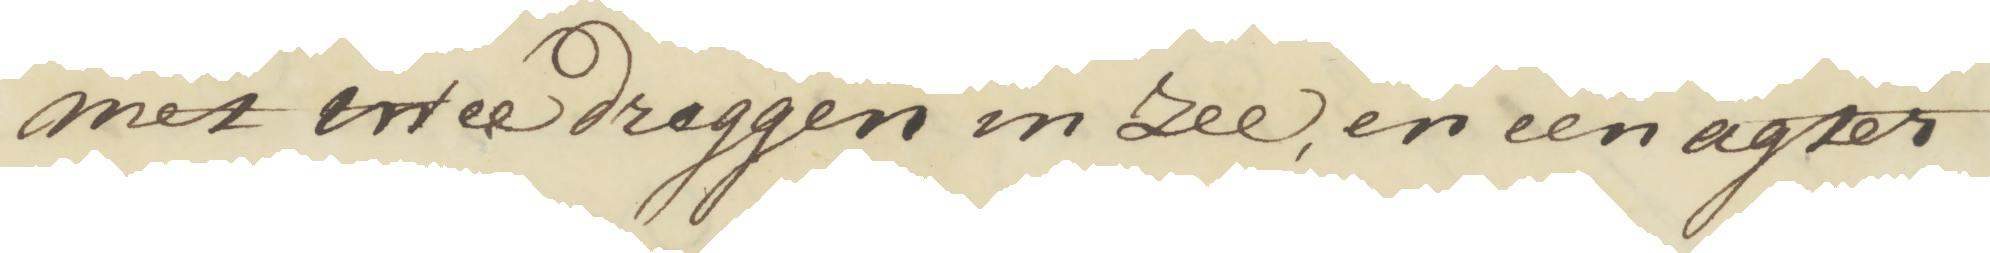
met twee dreggen in zee, en een agter
